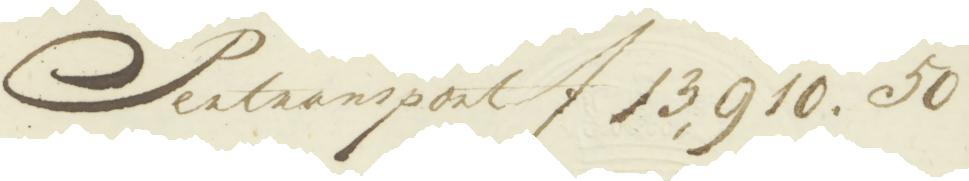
Per transport ƒ13,910.50
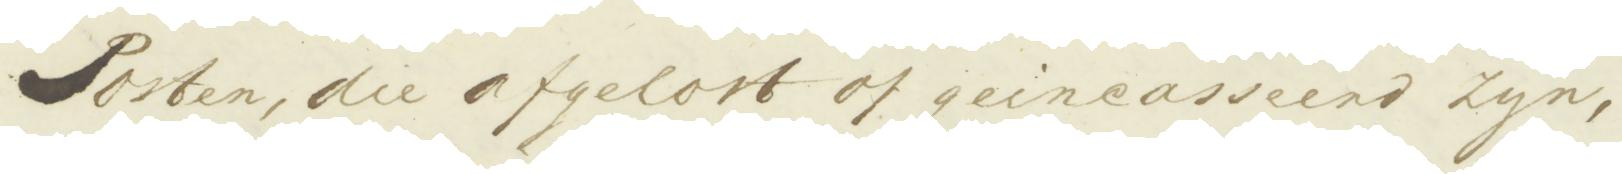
Posten, die afgelost of geincasseerd zyn,
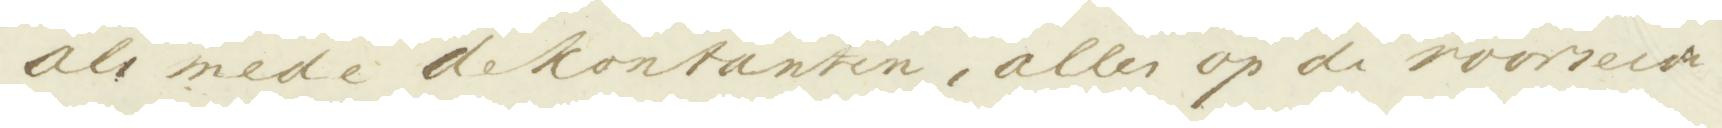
als mede de kontanten, alles op de voorseide
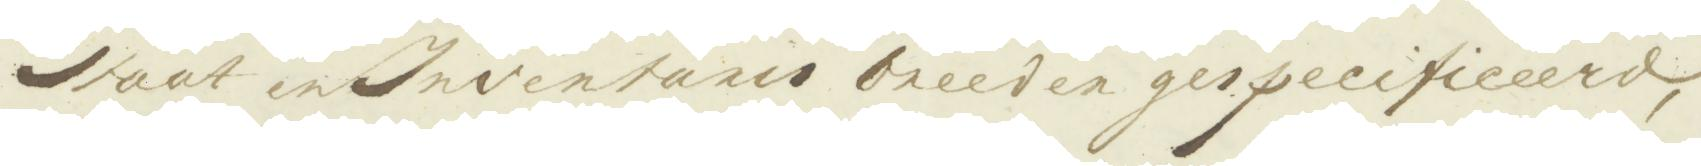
staat en Inventaris breeder gespecificeerd,
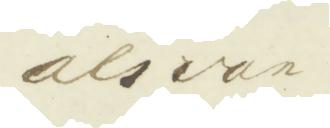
als van
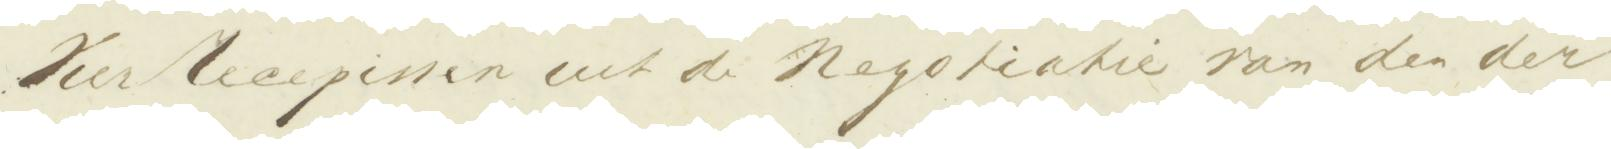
Vier recepissen uit de Negotiatie van den der
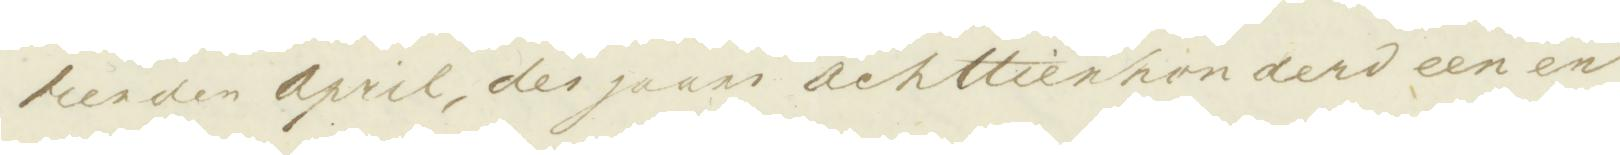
tienden april, des jaars achttien honderd een en
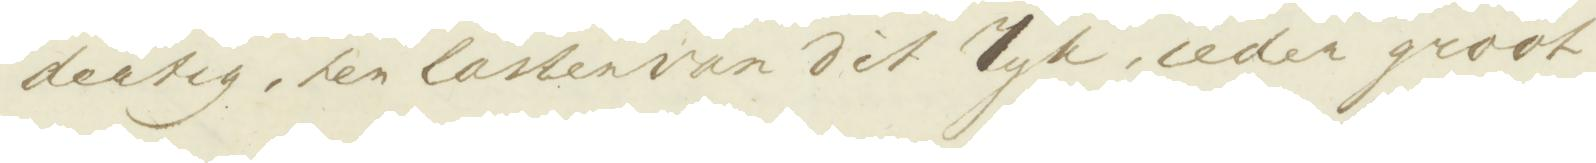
dertig, ten lasten van dit ryk, ieder groot
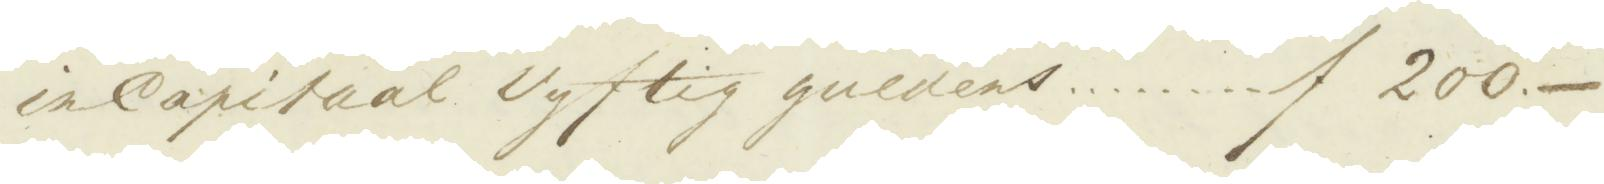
in capitaal vyftig guldens. . . . . . . . . ƒ 200.—
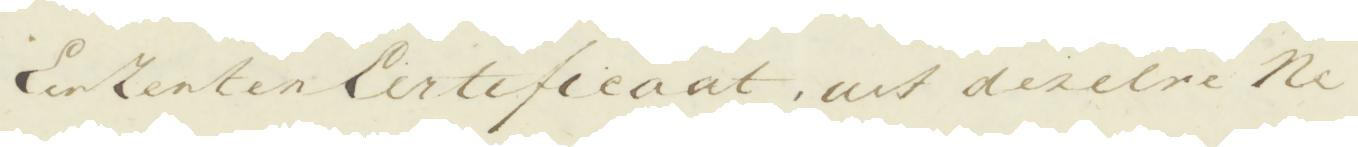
En renten Certificaat, uit dezelve Ne
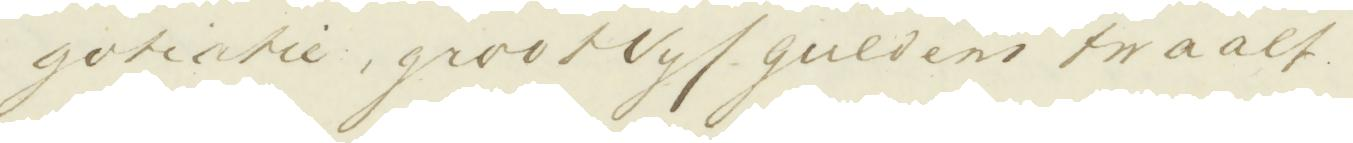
gotiatie, groot vyf guldens twaalf
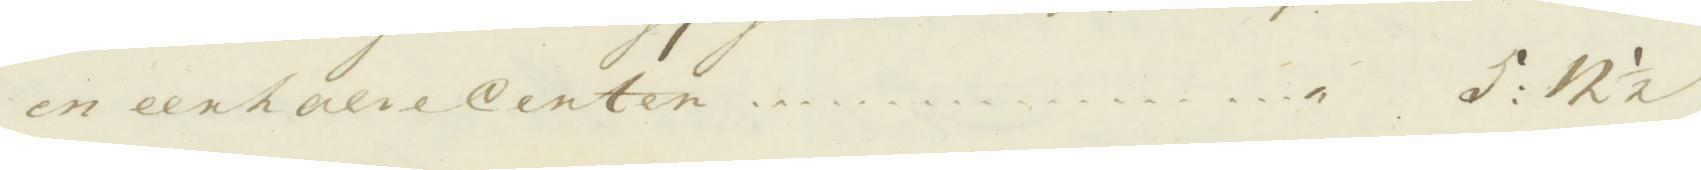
en een halve Centen . . . . . . . . . . . . . . . . . . . „ 5:12½
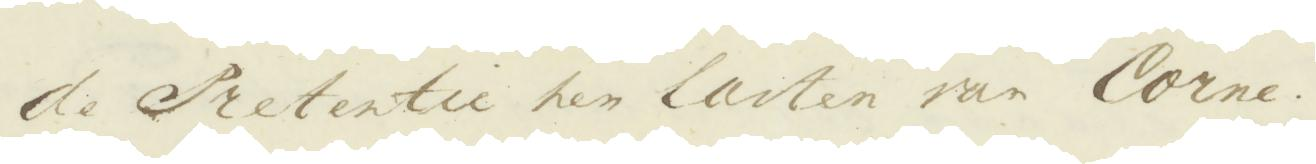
de Pretentie ten lasten van Corne.
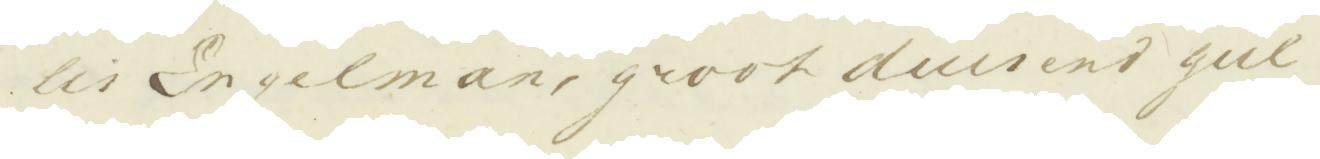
lis Engelman, groot duisend gul
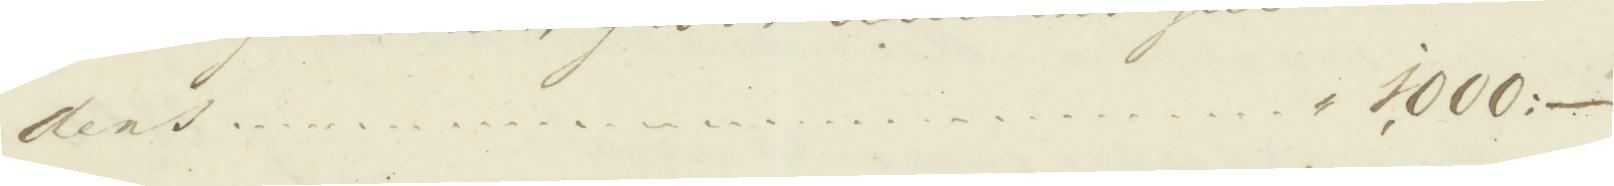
dens „ . . . . . . . . . .. . .. . . „ 1,000:—
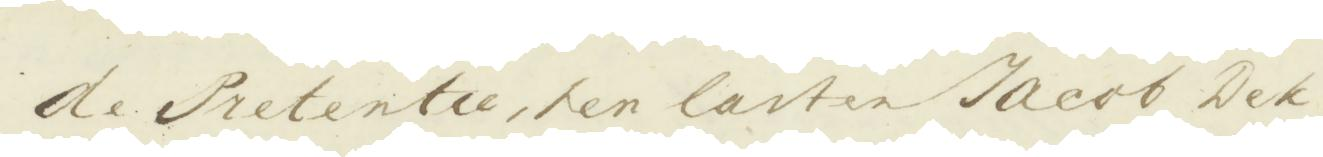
de Pretentie, ten lasten Jacob Dek
